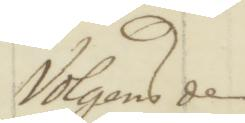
Volgens de
